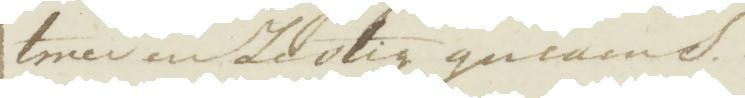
twee en Zestig guldens.
